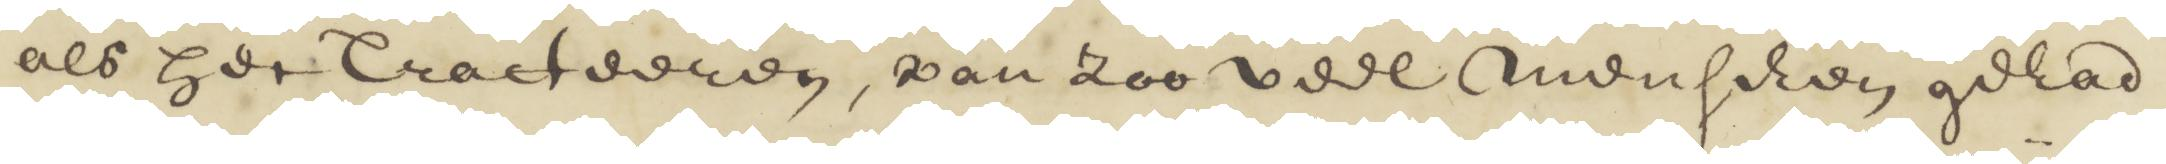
als het Tracteeren, van zoo veel menschen gehad
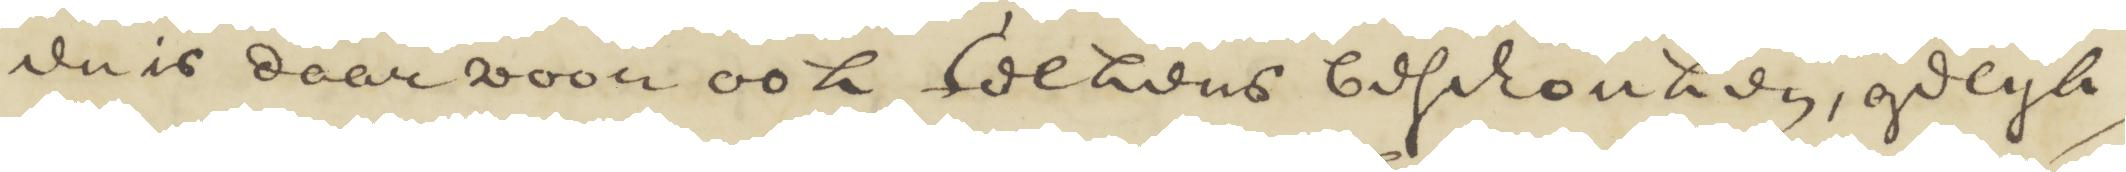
en is daar voor ook telkens beschonken, gelijk
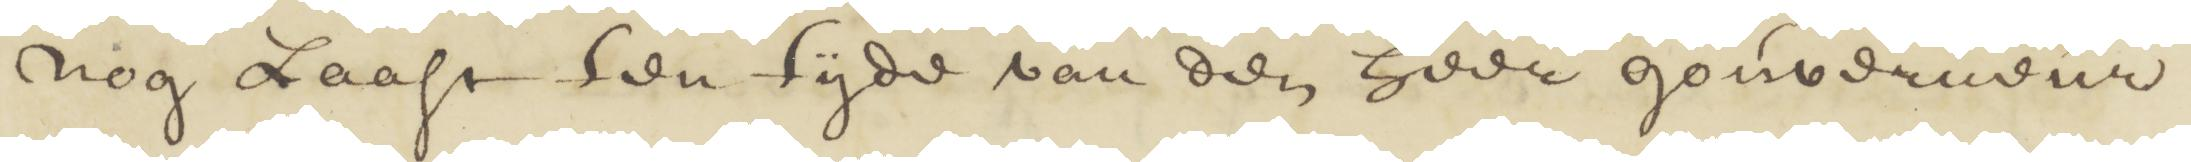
nog laast ten tijde van den heer gouverneur
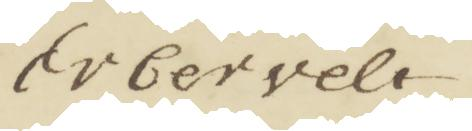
Erbervelt
